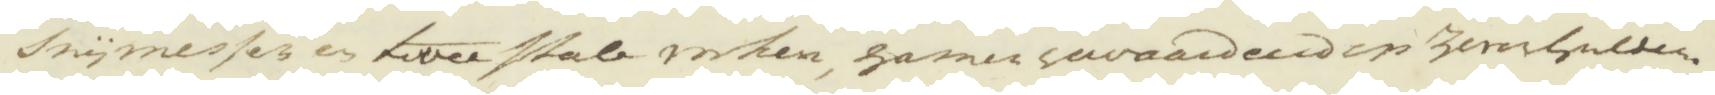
snijmessen en twee stale vorken, zamen gewaardeerd op Zeven Gulden.
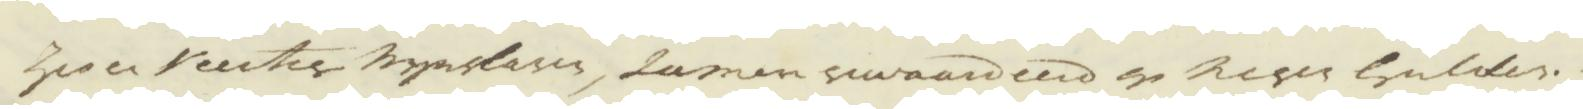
Zes en Veertig wynglazen, zamen gewaardeerd op negen Gulden.
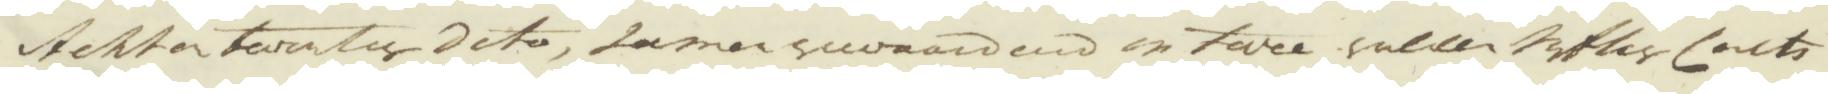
Achten twintig dito, zamen gewaardeerd op twee gulden Vyftig Cents
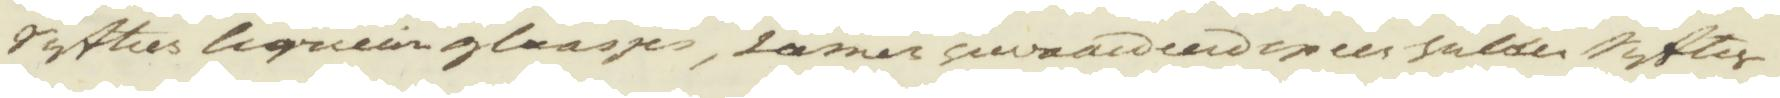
Vyftien liqueur glazen, zamen gewaardeerd op een gulden Vyftig
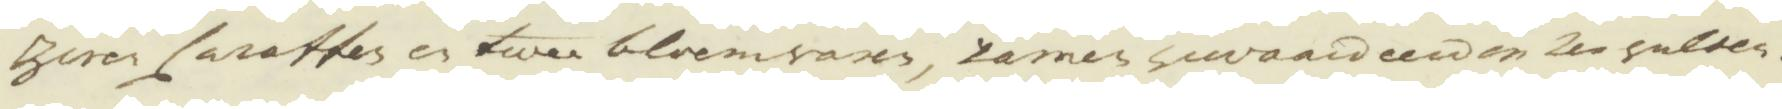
Zeven Caraffen en twee bloemvasen, zamen gewaardeerd op zes gulden.
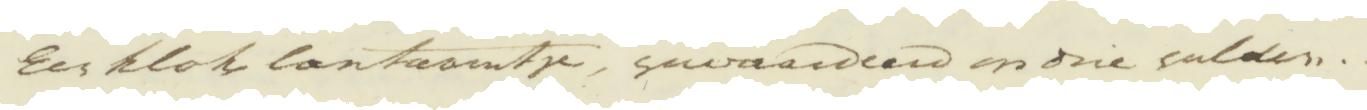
Een klok lantaarntje, gewaardeerd op drie gulden.
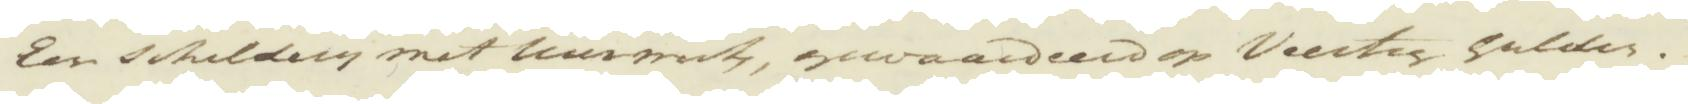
Een schildery met uurwerk, gewaardeerd op Veertig gulden.
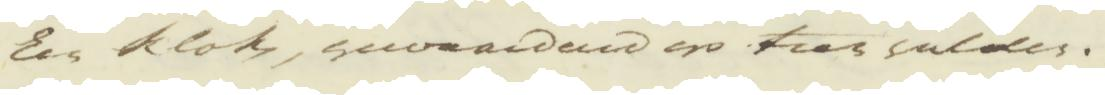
Een klok, gewaardeerd op tien gulden.
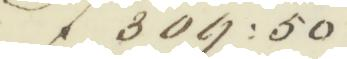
ƒ 309: 50
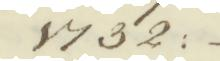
1732:
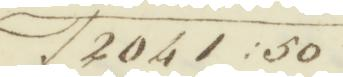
ƒ2041:50
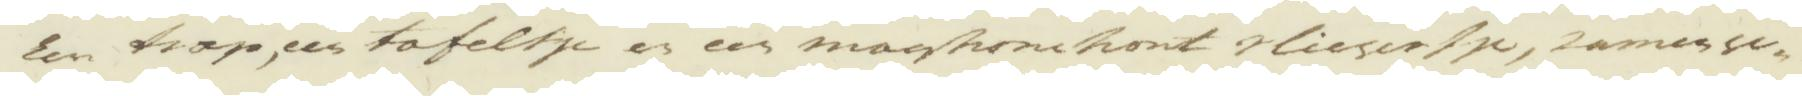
Een trap, een tafeltje en een maghonihout vliegertje, zamen ge„
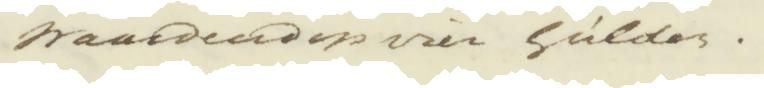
waardeerd op vier Gulden.
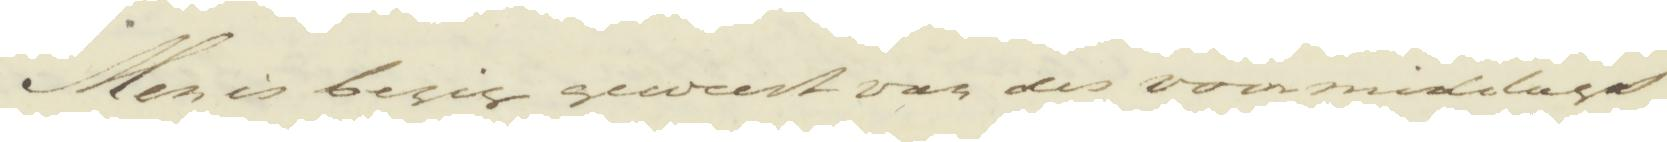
Men is bezig geweest van des voormiddags
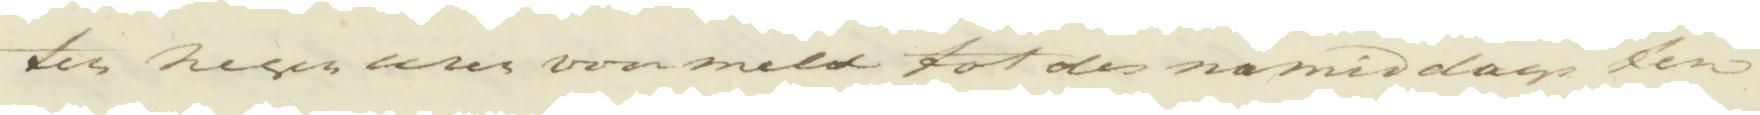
ten negen uren voormeld tot des namiddags ten
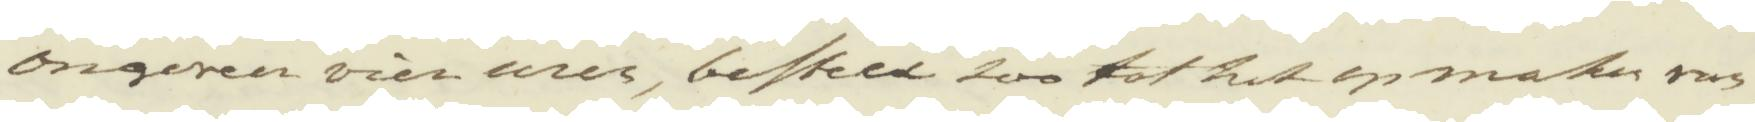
ongeveer vier uren, besteld zoo tot het op maken van
